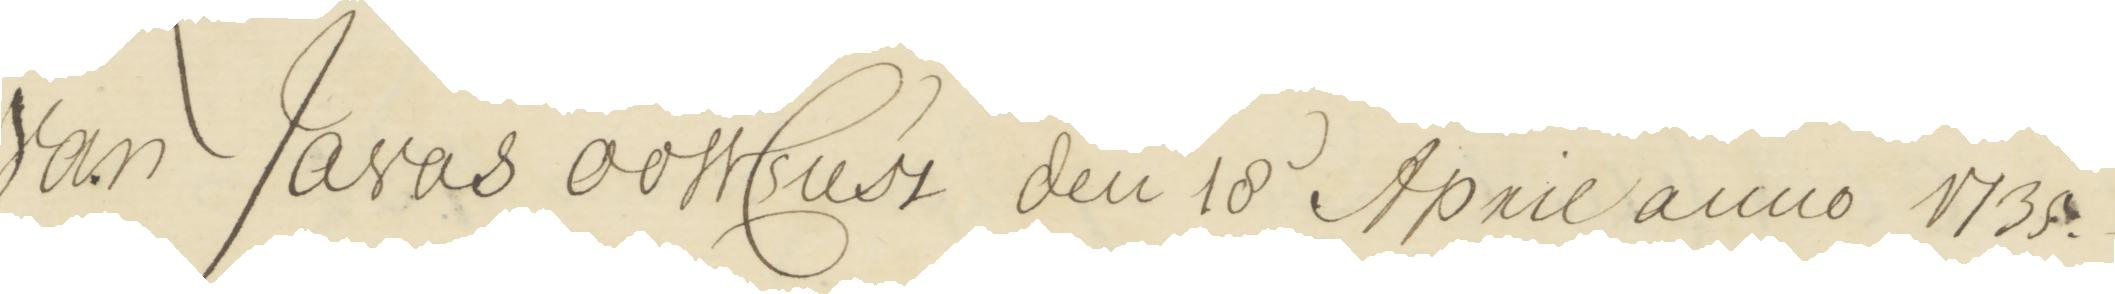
Van Javas oostCust den 18' April anno 1733.
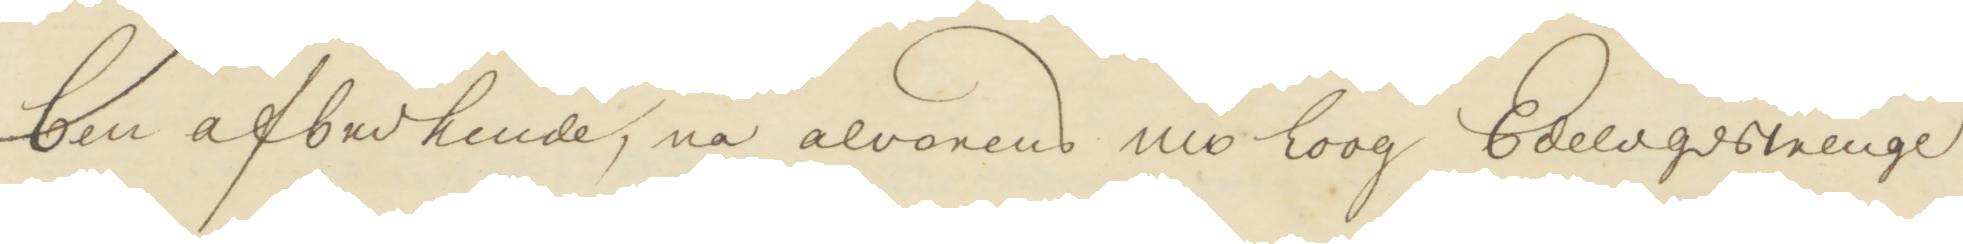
ben afbrekende, na alvorens uw hoog Edele gestrenge
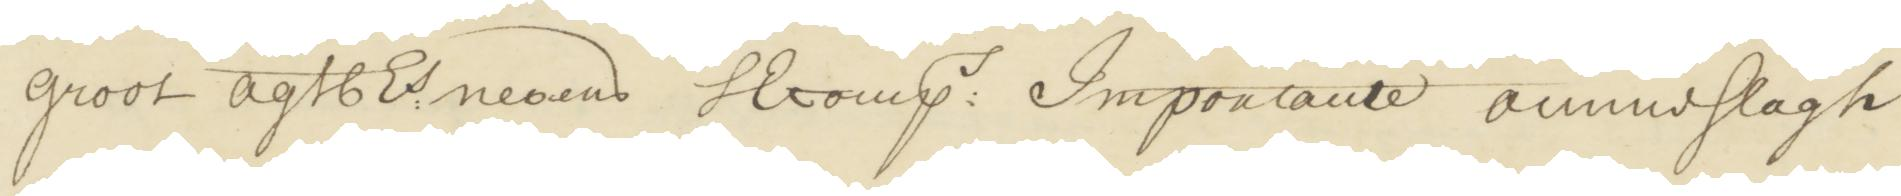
groot agtbh:s nevens 'sEcomp:s Importante ommeslagh
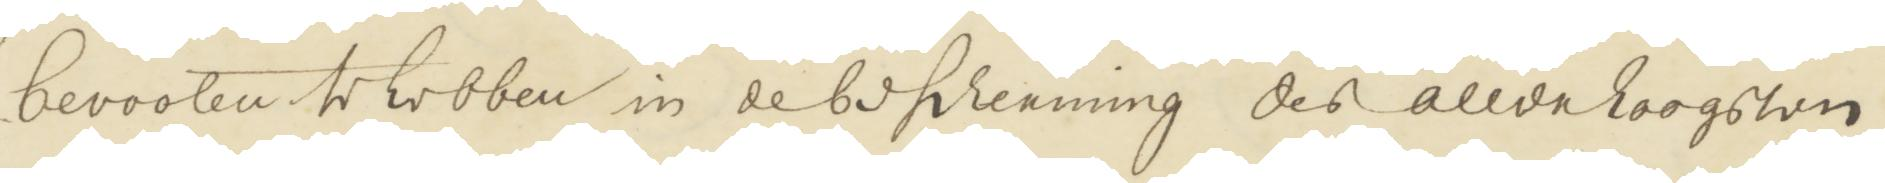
bevoolen te hebben in de bescherming des aller hoogsten
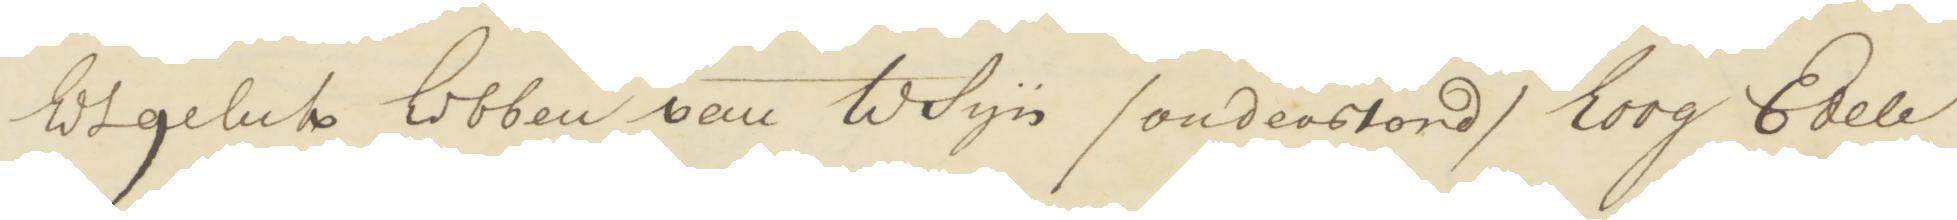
het geluk hebben van tesijn /onderstond/ hoog Edele
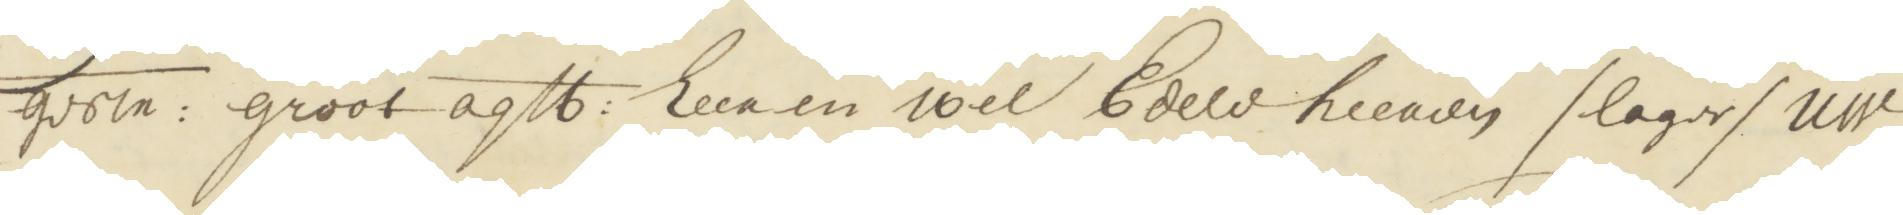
gestr: groot agtb: heer en wel Edele heeren /lager/ uw
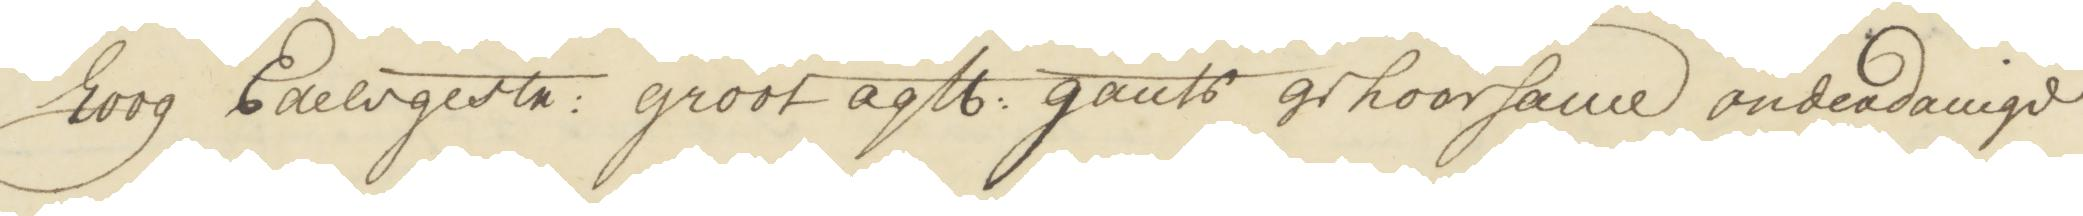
hoog Edele gestr: groot agtb: gants gehoorsame onderdanige
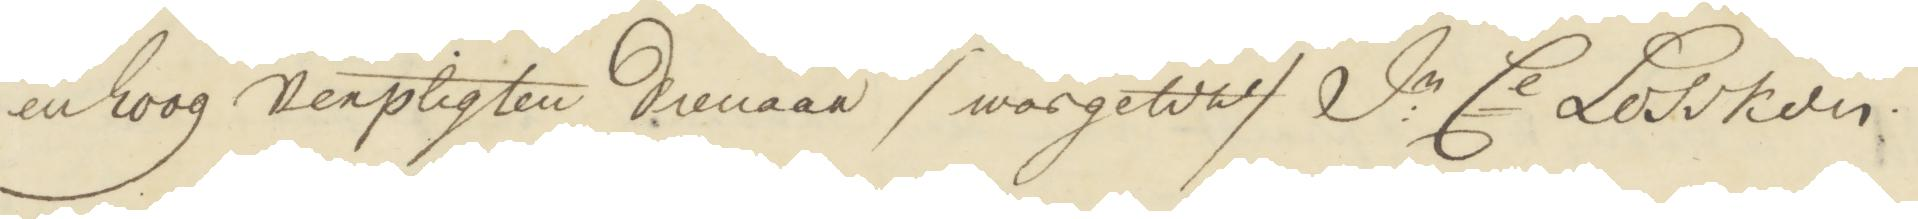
en hoog verpligten dienaar /was getekt/ J:n C=l Lossken:
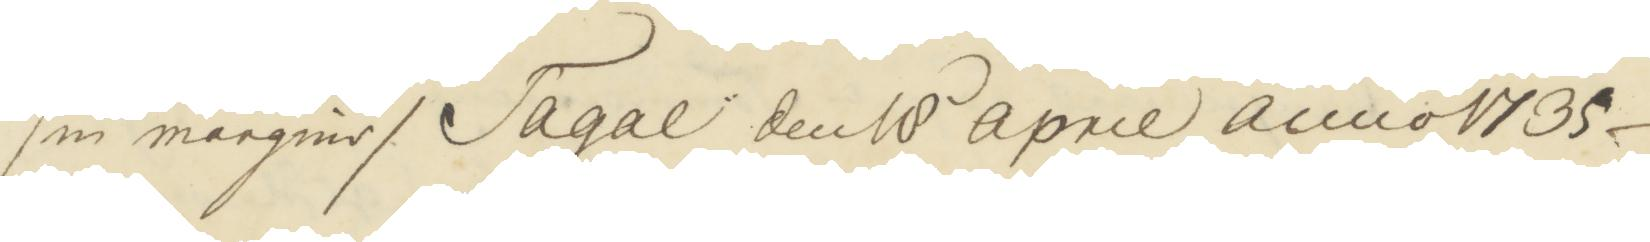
/in margine/ Tagal den 18 april anno1735-
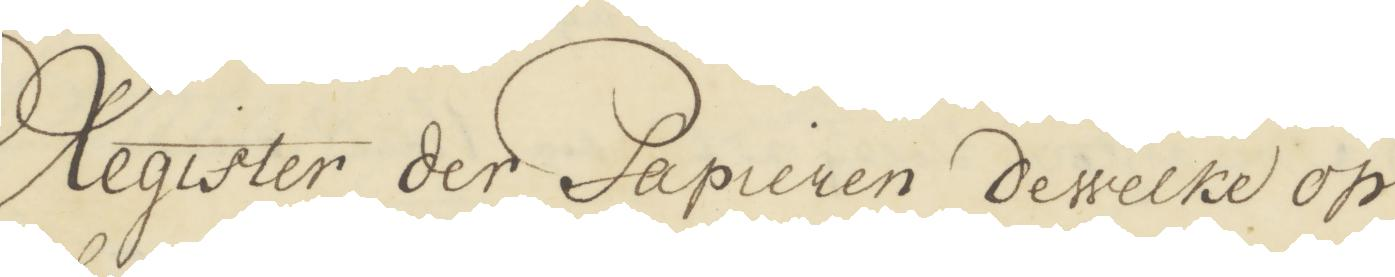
Register der Papieren dewelke op
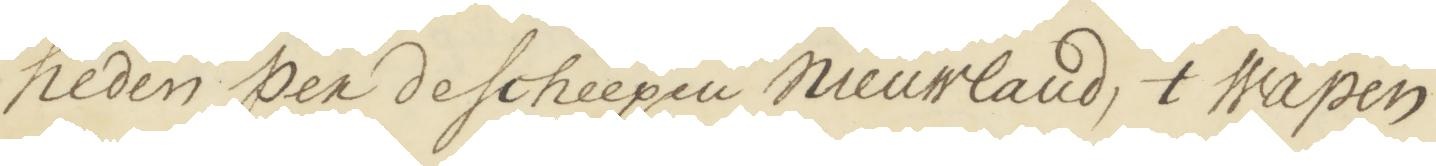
heden per descheepen nieuwland, ’t wapen
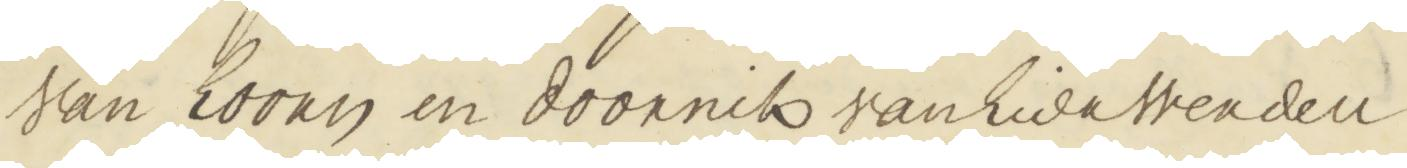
van hoorn en doornik van hier werden
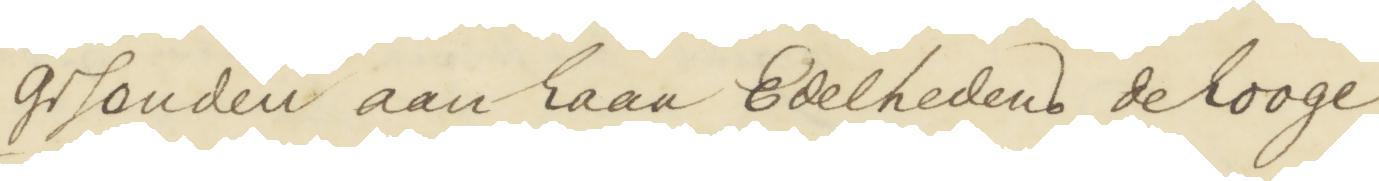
gesonden aan haar Edelhedens dehooge
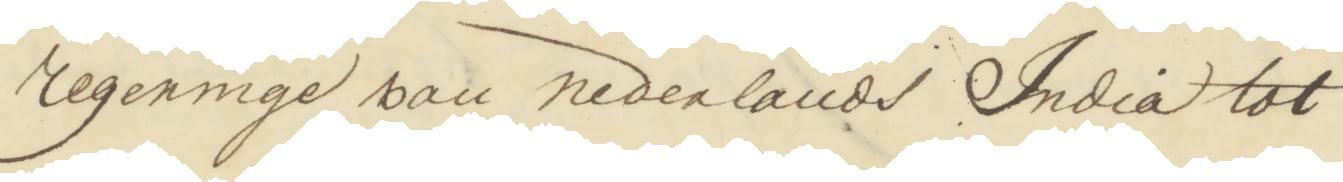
regeringe van nederlands India tot
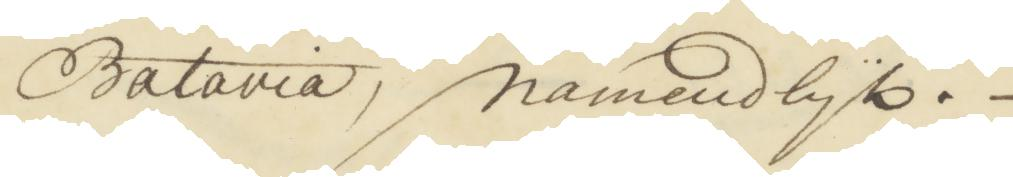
Batavia, namendlijk.
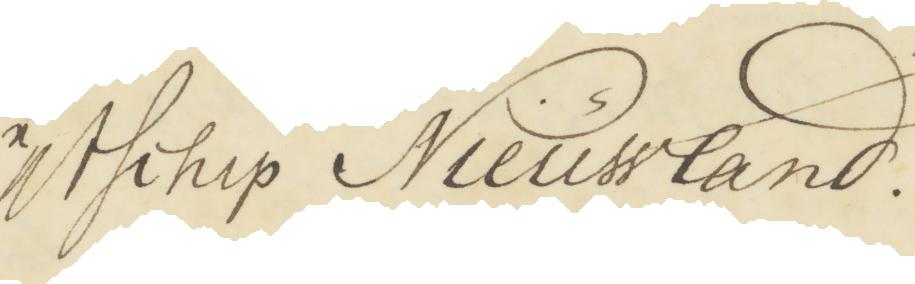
Pr„ tschip Nieuwland.
